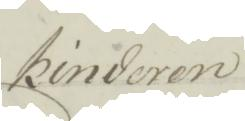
kinderen
